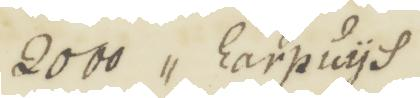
2000 „ harpuijs
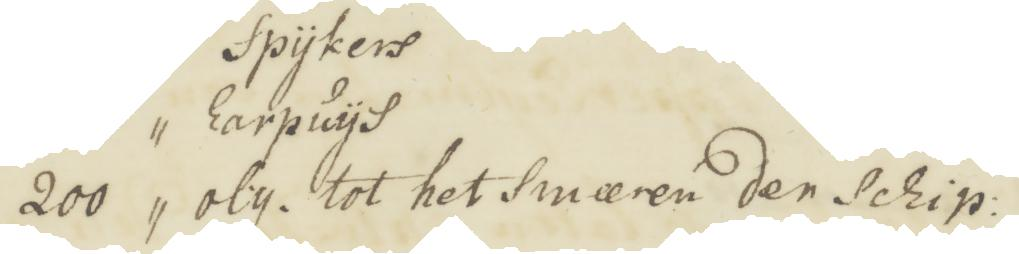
200 „ oly. tot het Smeeren der schip:
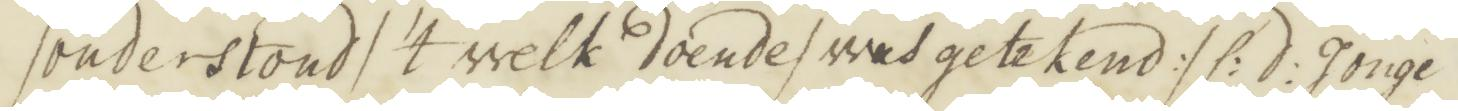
/onderstond / ’t welk doende /was getekend:/ C: d: Jonge
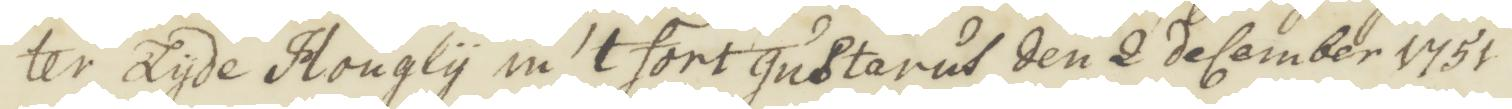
ter Zijde Houglij in ’t fort gustavus den 2 december 1751
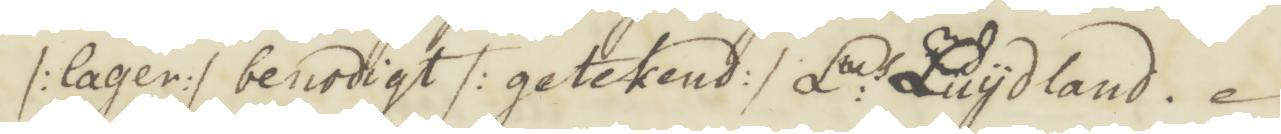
/:lager:/ benodigt /:getekend:/ L:as Zuijdland.—
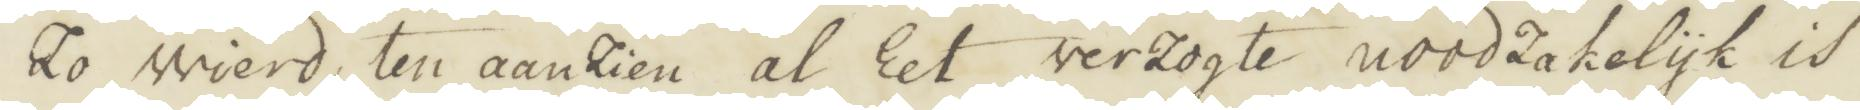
Zo wierd, ten aanzien al het verzogte noodzakelijk is
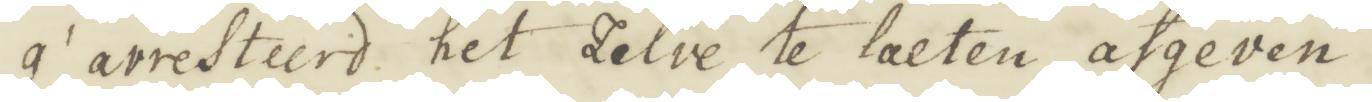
g’arresteerd het zelve te laeten afgeven
